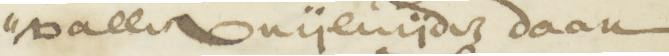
„vallen vrijluijden daar
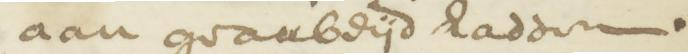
aan gearbeijd hadden.
